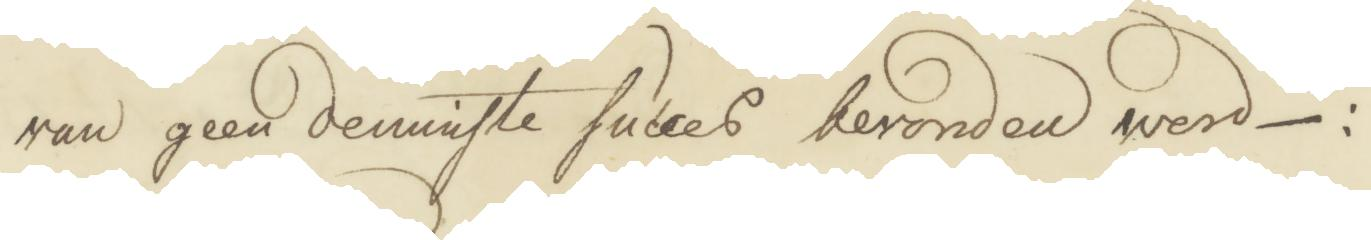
van geen deminste succes bevonden werd —:
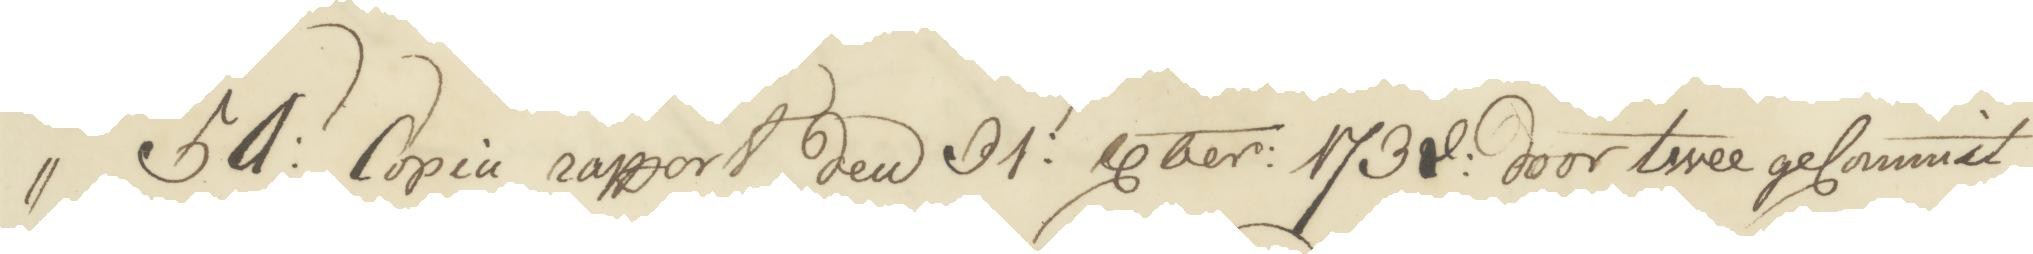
„ 54:' Copia rapport den 31:' xber: 1732: door twee gecommit
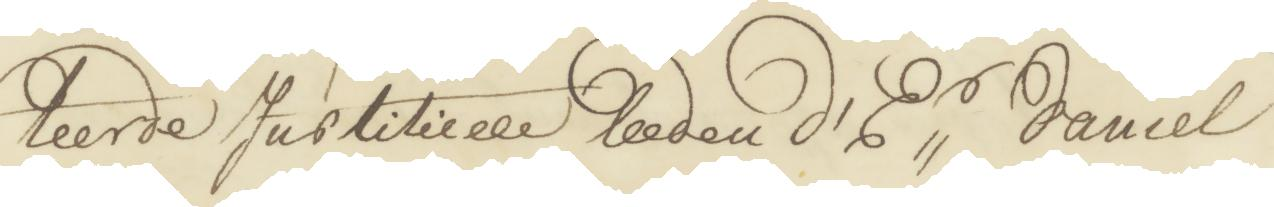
teerde Justitieele leeden dE„s daniel
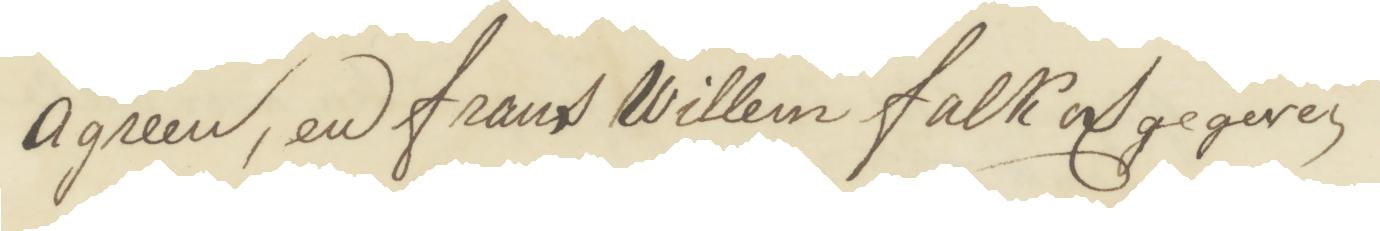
Agreen, en Frans Willem Falk overgegeven
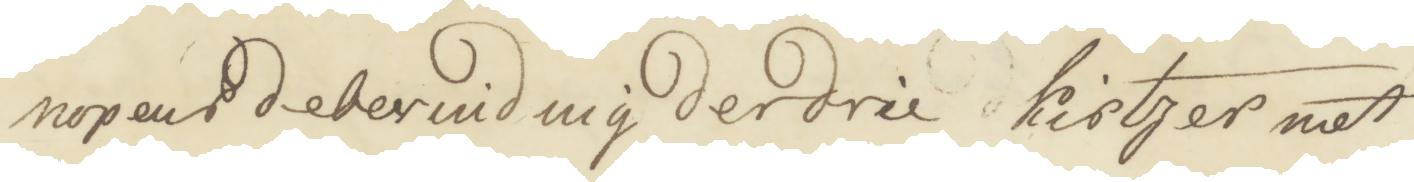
nopens debevinding der drie kistjes met
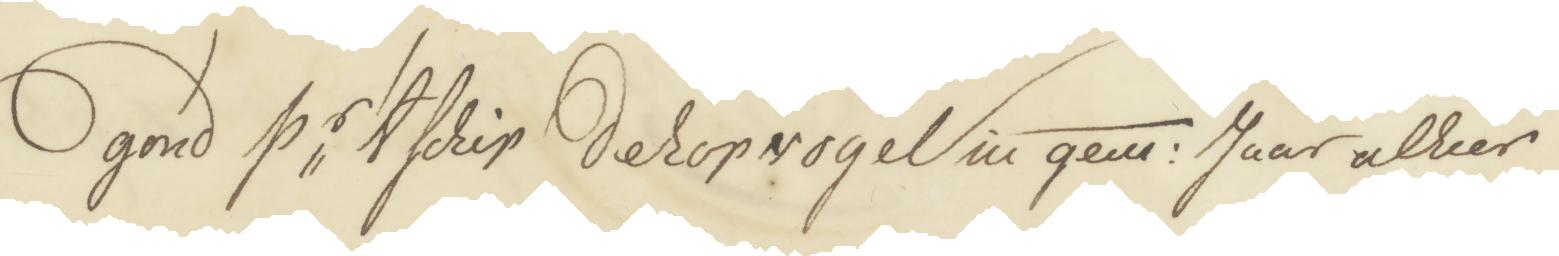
goud p„r 't schip dehopvogel in gem: Jaar alhier
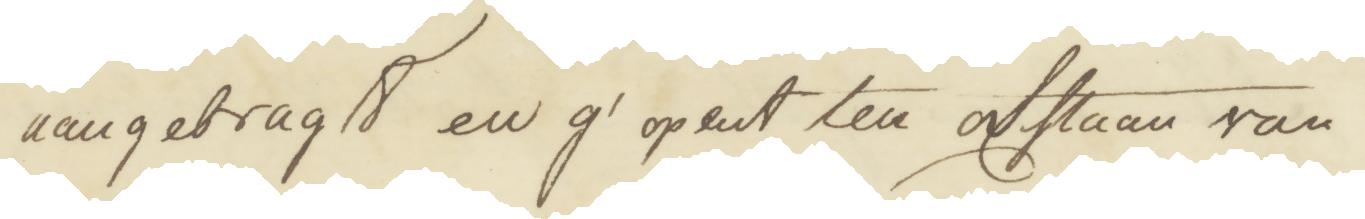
aangebragt en g’opent ten overstaan van
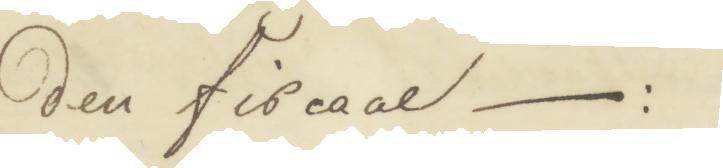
den fiscaal —:
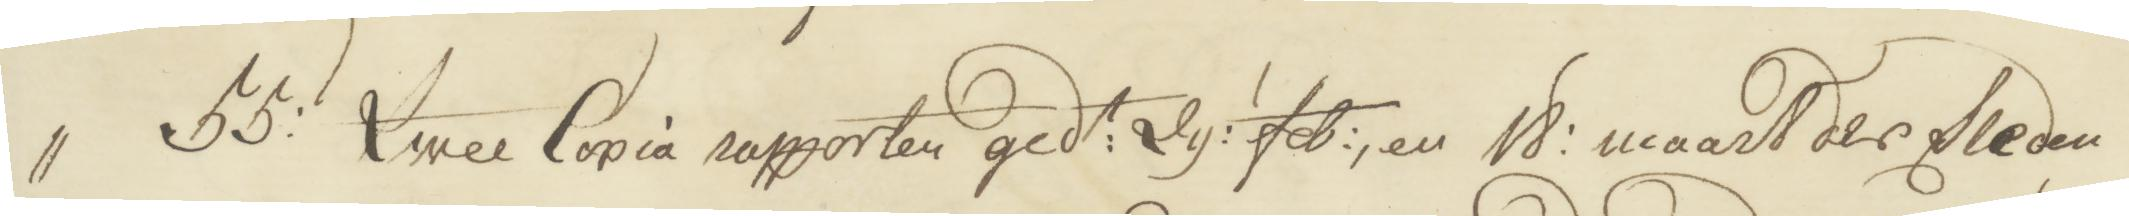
„ 55: Twee Copia rapporten ged:t 29:' feb:, en 18: maart des verleden
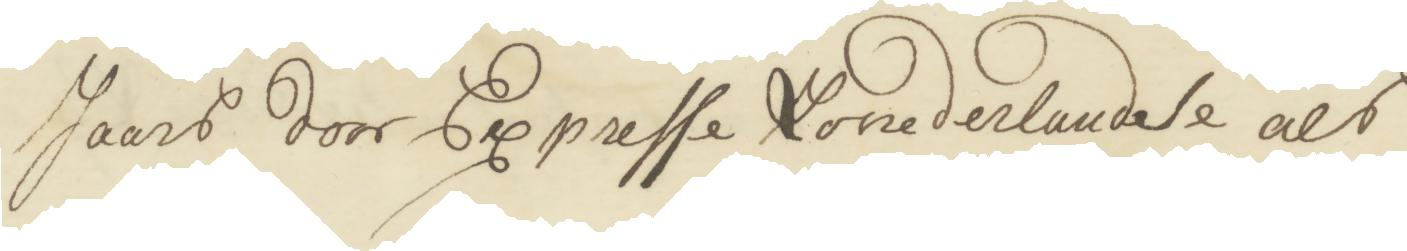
Jaars door Expresse zonederlandse als
